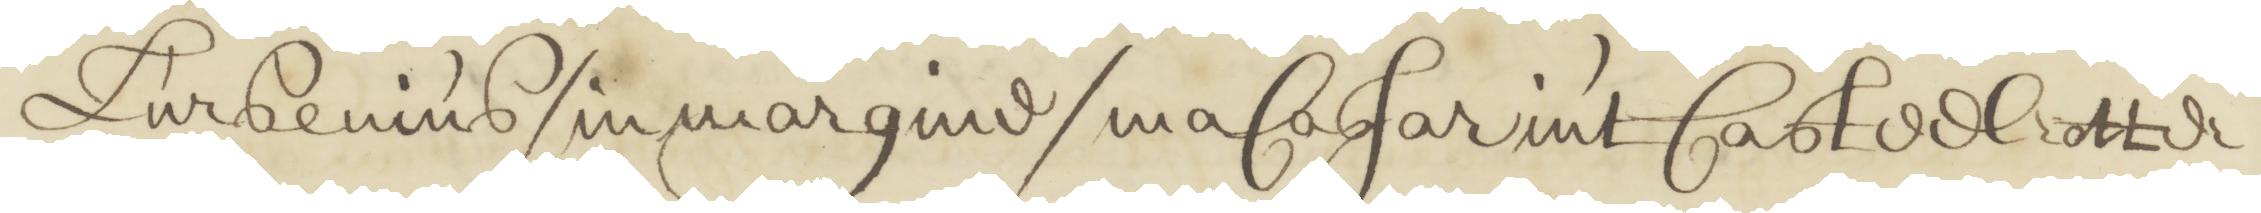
Lursenius /in margine/ macassar in’t Casteel rotter
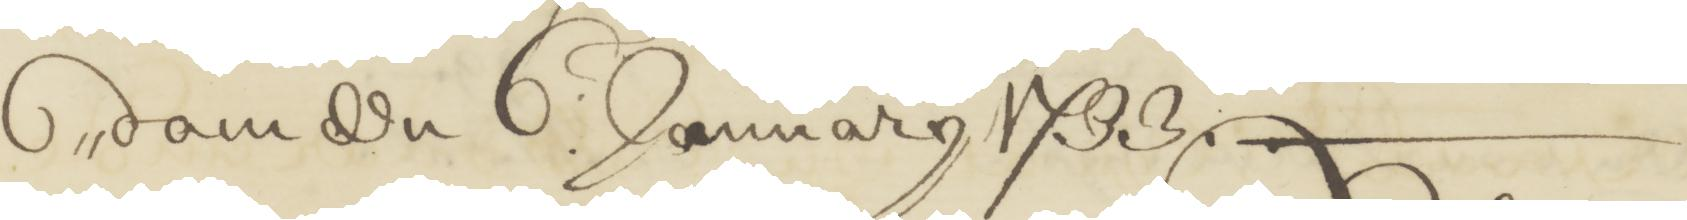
„dam den 6:' Januarij 1733. —
